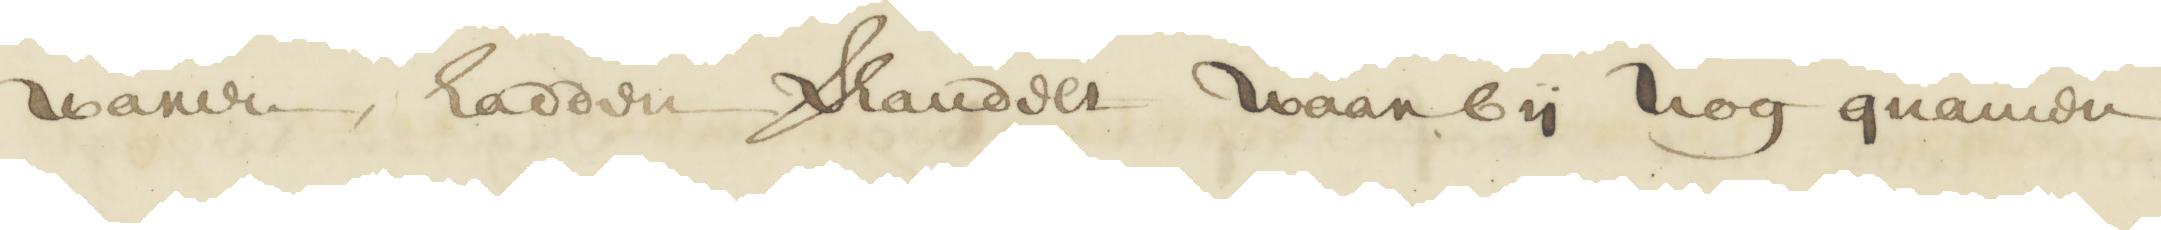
waren, hadden verhandelt waar bij nog quamen
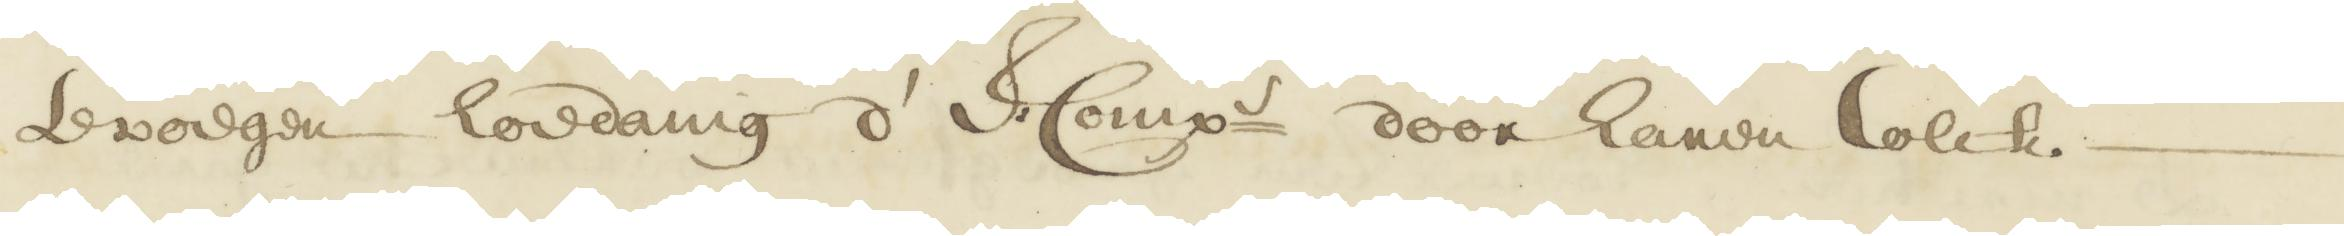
te voegen hoedanig d’ E:Comp=s door haren tolck —
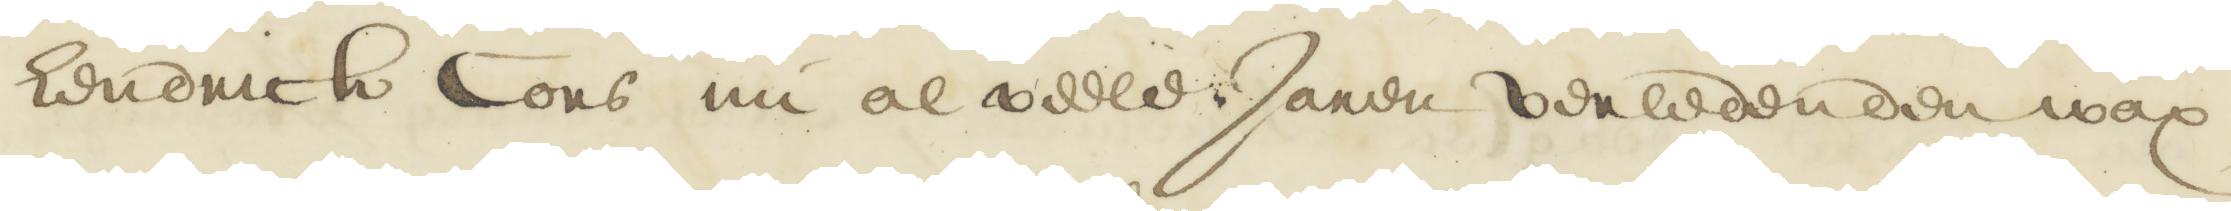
hendrick Cors nu al veele Jaren verleden den wax
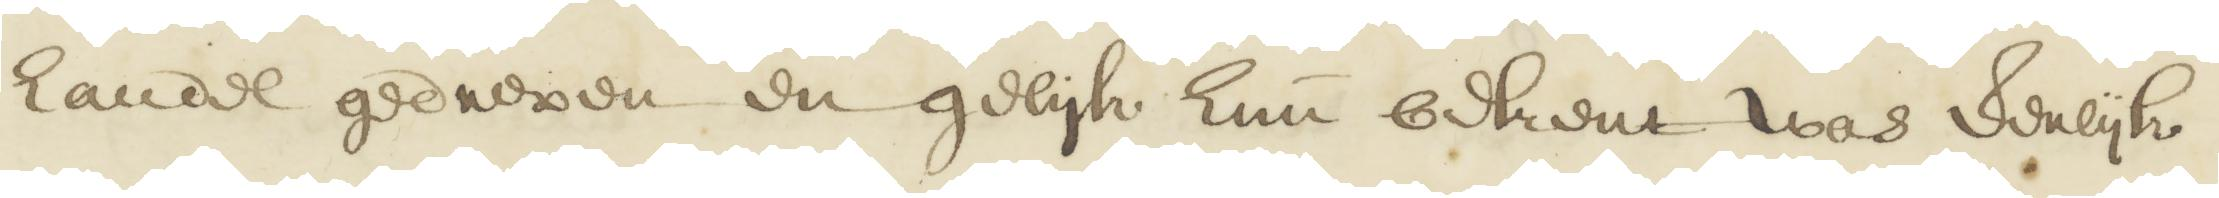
handel gedreven en gelijk hun bekent was Eerlijk
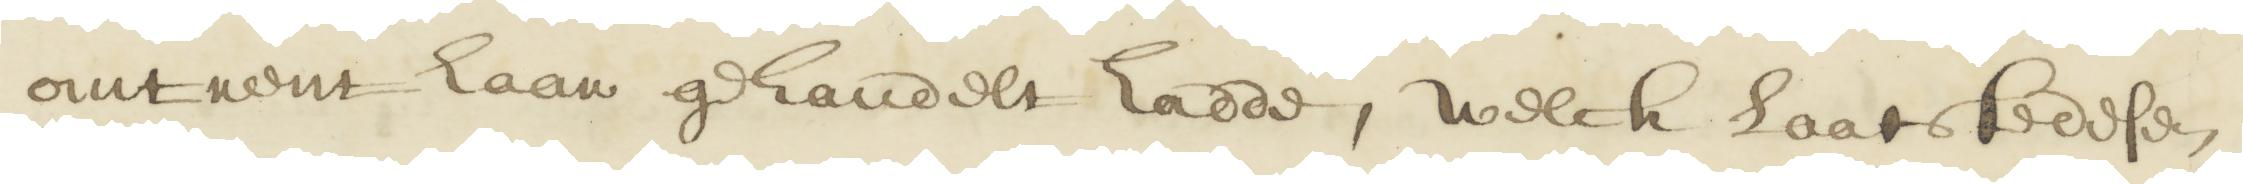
omtrent haar gehandelt hadde, welck laatste desen
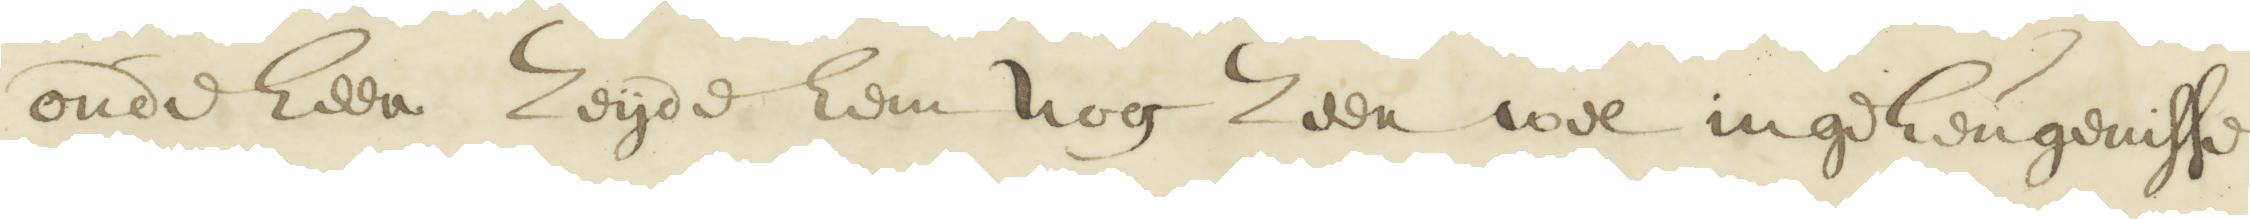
oude heer zeijde hem nog zeer wel in geheugenisse
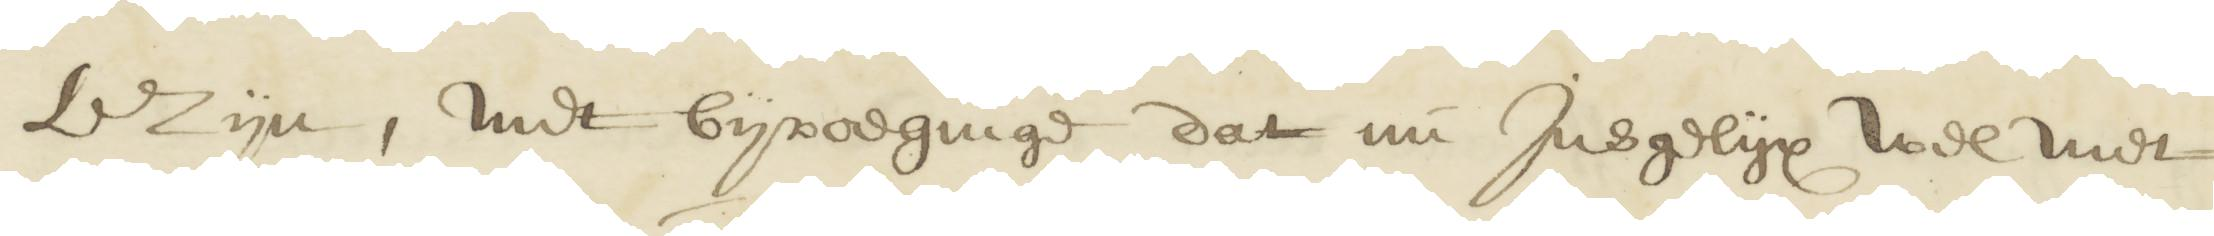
tezijn, met bijvoeginge dat nu Jnsgelijx wel met
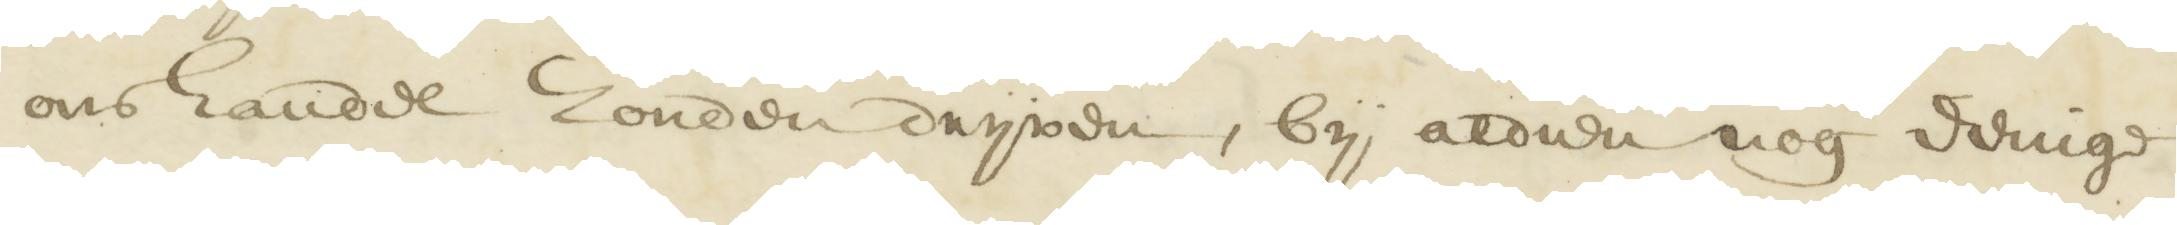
ons handel zouden drijven, bij aldien nog eenige
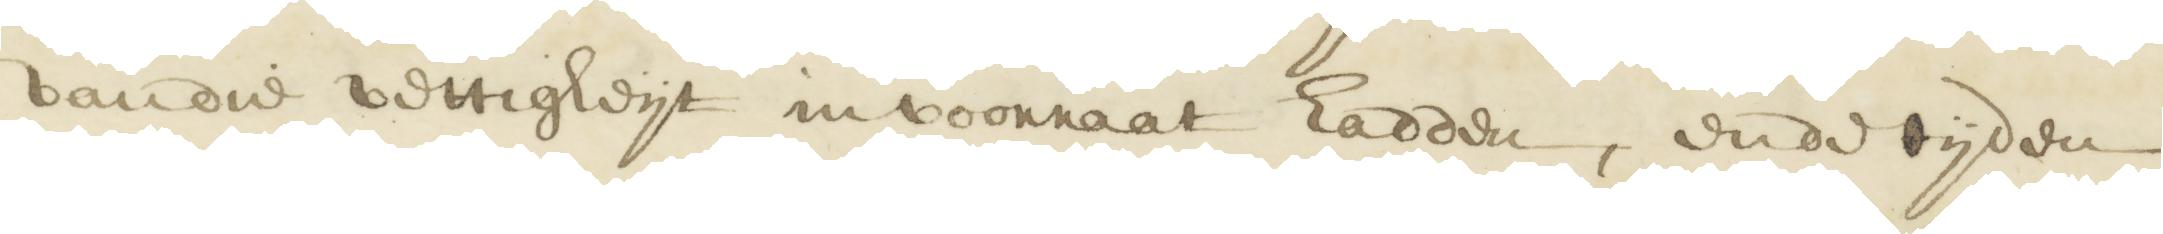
van die vettigheijt in voorraat hadden, ende tijden
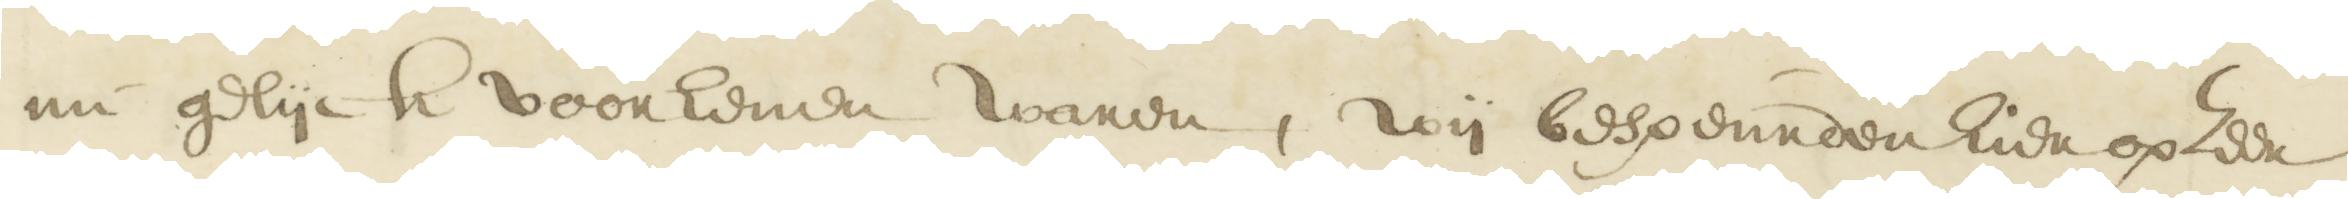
nu gelijck voorhenen waren, wij bespeurden hier op zeer
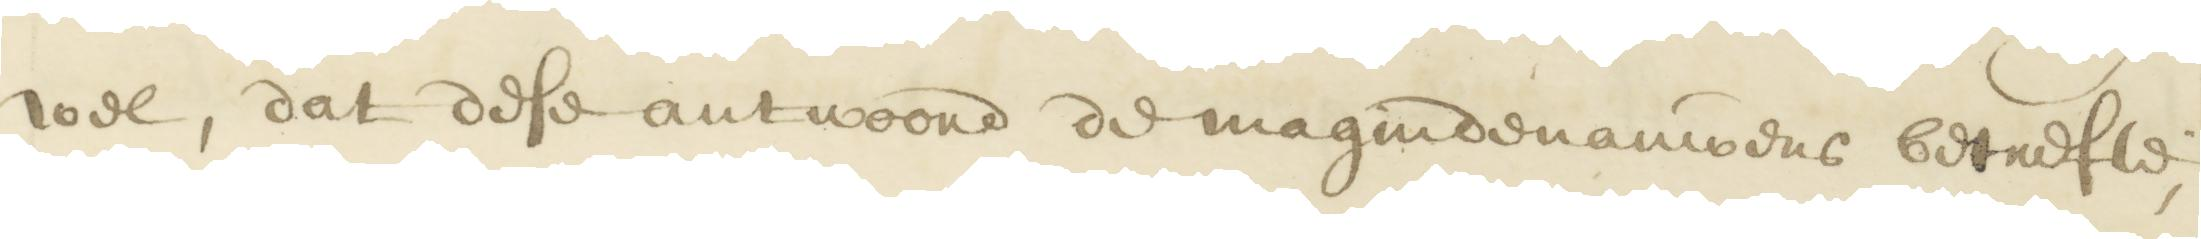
wel, dat dese antwoord de magindenauwers betrefte,
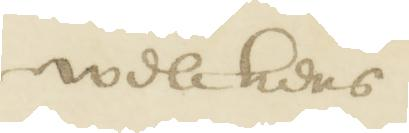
welckers
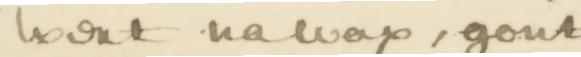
wert na wax, gout
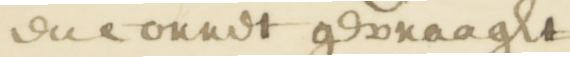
en corret gevraaght
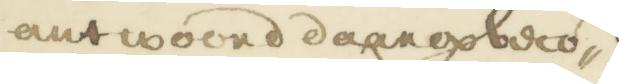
antwoord daar op beco„
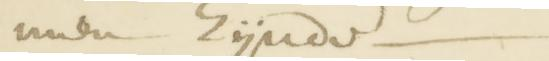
men zijnde —
